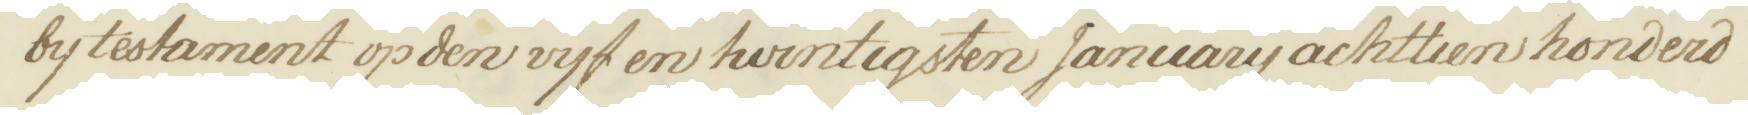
by testament op den vyf en twintigsten January achttien honderd
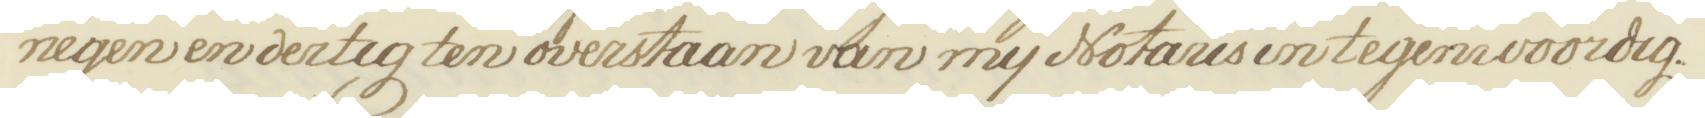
negen en dertig ten overstaan van my Notaris in tegenwoordig„
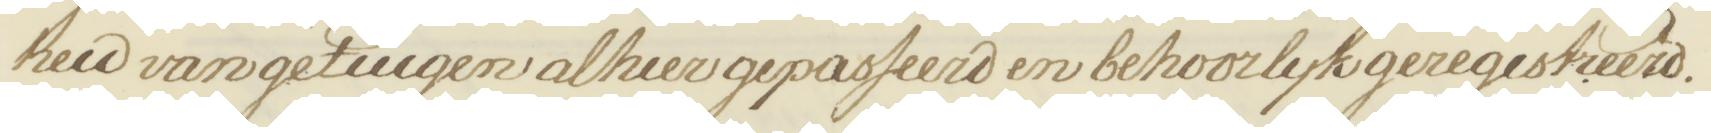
heid van getuigen alhier gepasseerd en behoorlyk geregestreerd,
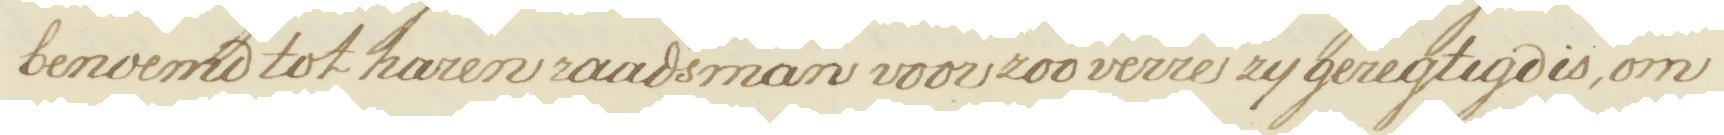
benoemd tot haren raadsman voor zoo verre zy geregtigd is, om
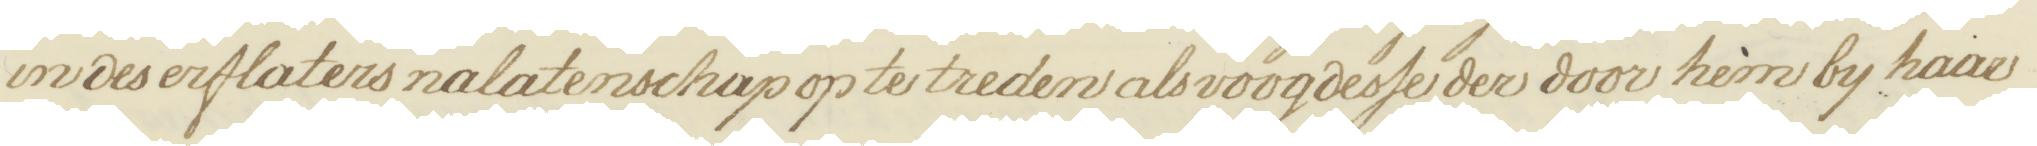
in des erflaters nalatenschap op te treden als voogdesse der door hem by haar
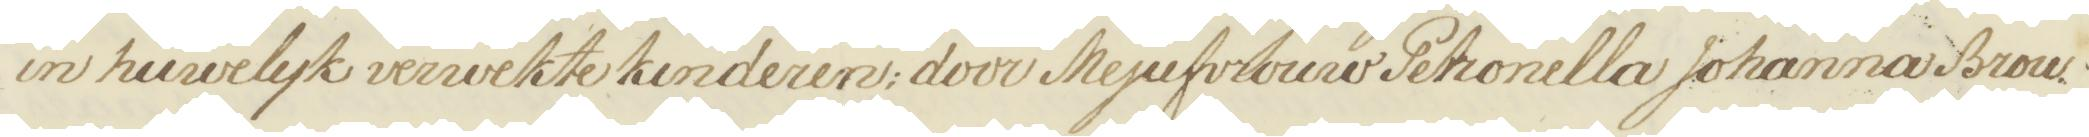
in huwelyk verwekte kinderen; door Mejufvrouw Petronella Johanna Brou„
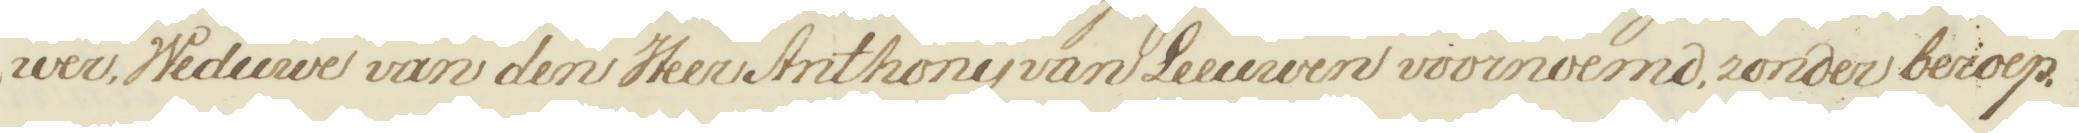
wer, Weduwe van den Heer Anthony van Leeuwen voornoemd, zonder beroep
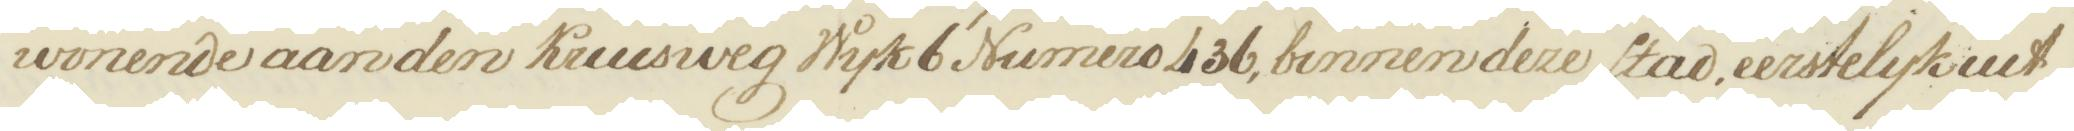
wonende aan den Kruisweg Wyk 6 Numero 436, binnen deze Stad, eerstelyk uit
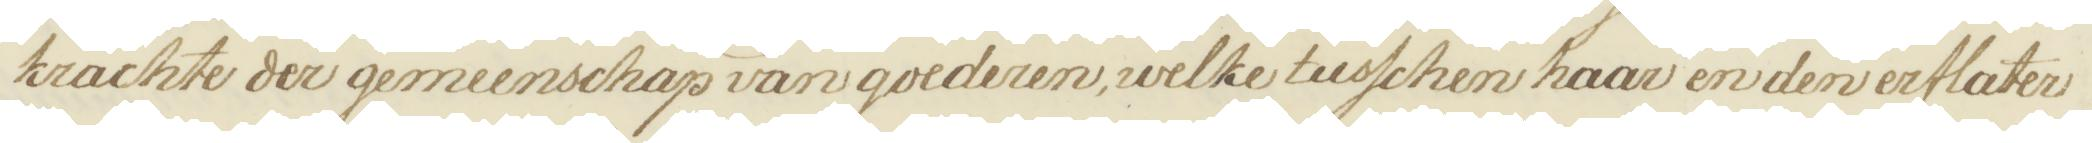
krachte der gemeenschap van goederen, welke tusschen haar en den erflater
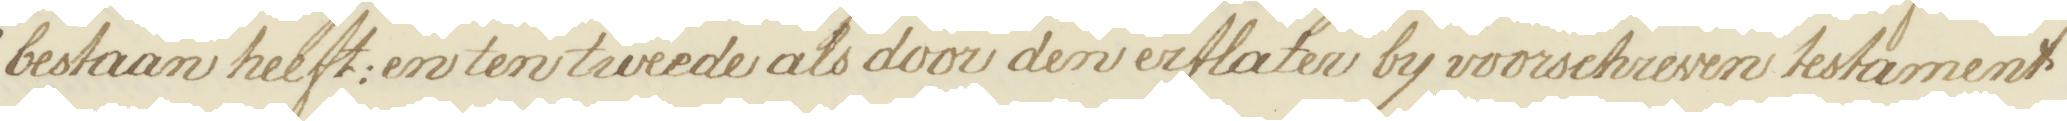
bestaan heeft, en ten tweede als door den erflater by voorschreven testament
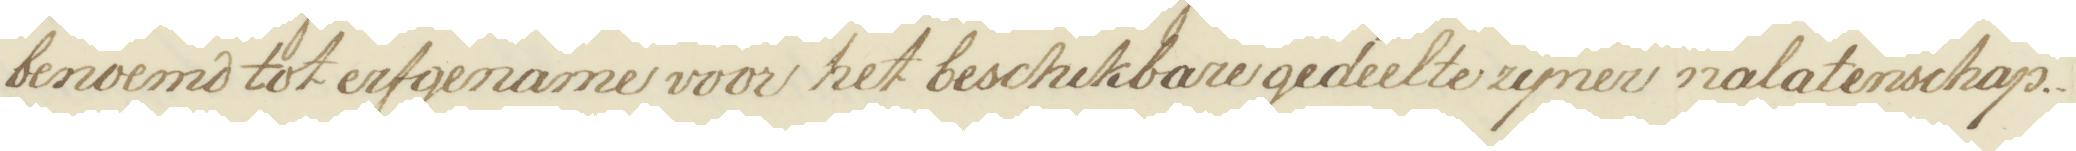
benoemd tot erfgename voor het beschikbare gedeelte zyner, nalatenschap.-
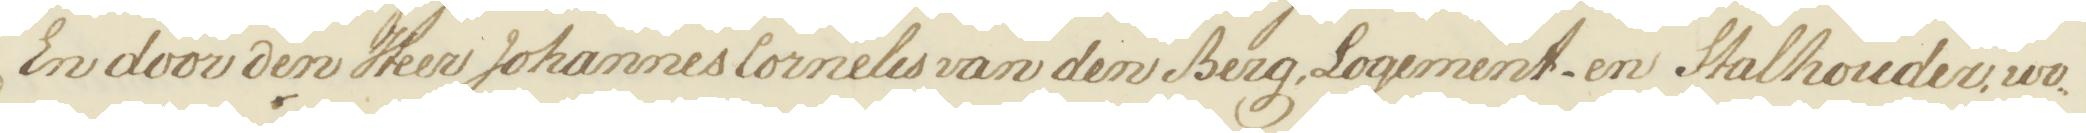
En door den Heer Johannes Cornelis van den Berg, Logement- en stalhouder, wo„
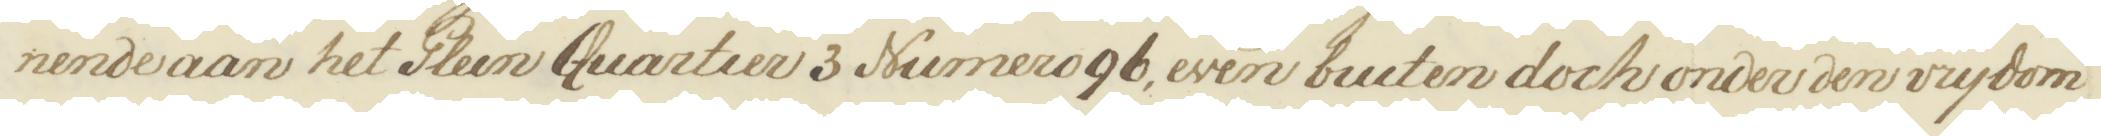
nende aan het Plein Quartier 3 Numero 96, even buiten doch onder den vrydom
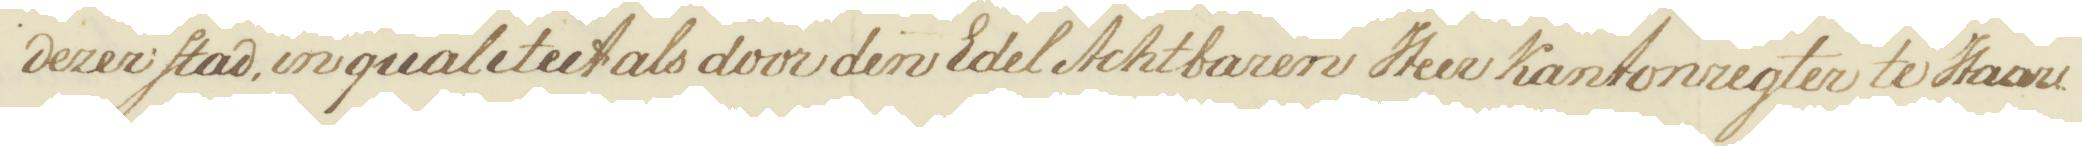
dezer stad, in qualiteit als door den Edel Achtbaren Heer Kantonregter te Haar
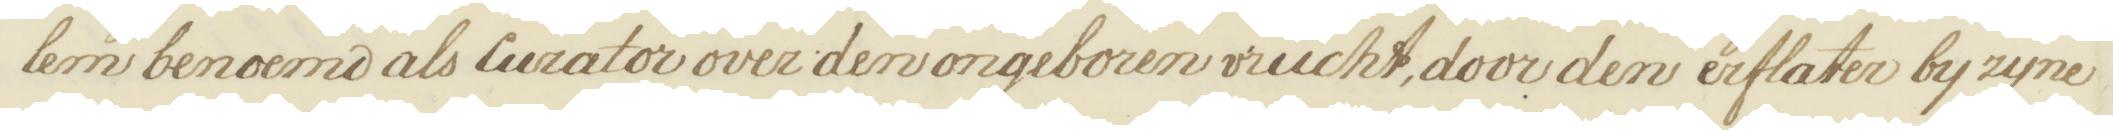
lem benoemd als Curator over den ongeboren vrucht, door den Erflater by zyne
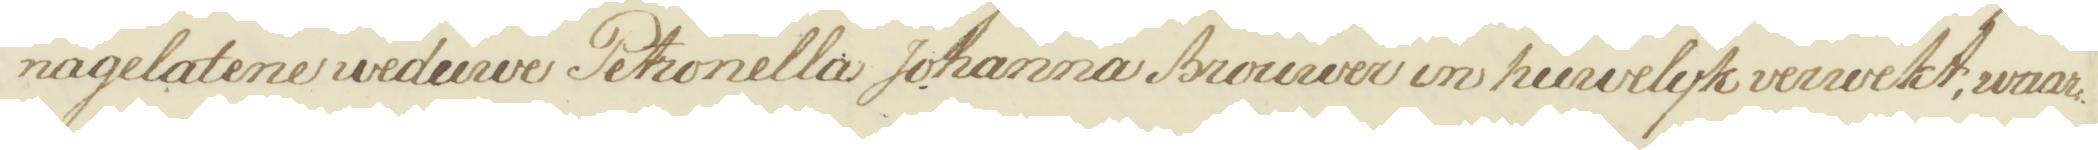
nagelatene weduwe Petronella Johanna Brouwer, in huwelyk verwekt, waar„
